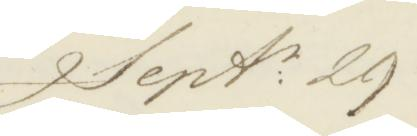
Sept:r 29
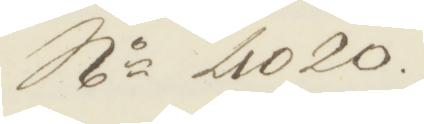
N=o 4020.
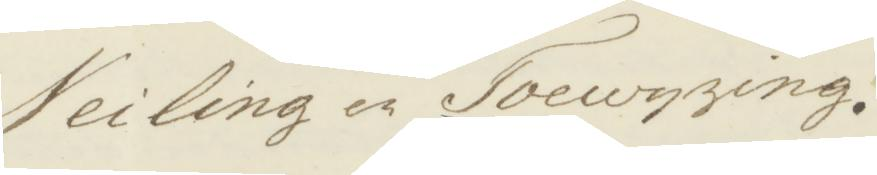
Veiling en Toewyzing.
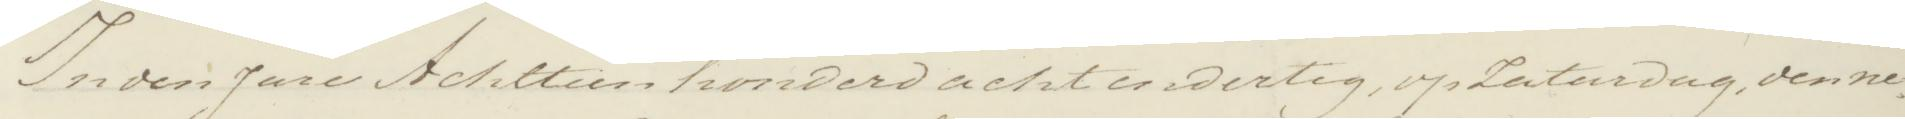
In den Jare Achttien honderd acht endertig, op Zaterdag, den ne
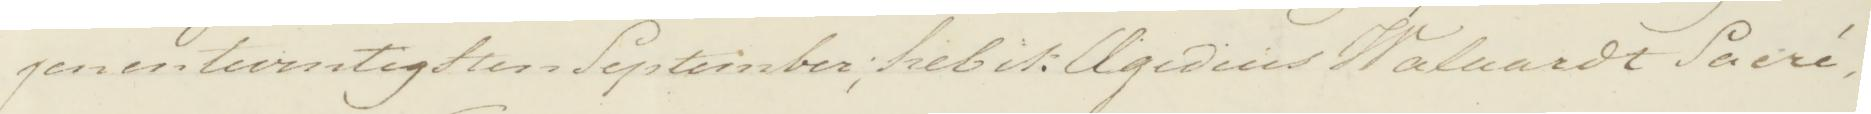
genen twintigsten September, heb ik AEgidius Walaardt Sacré,
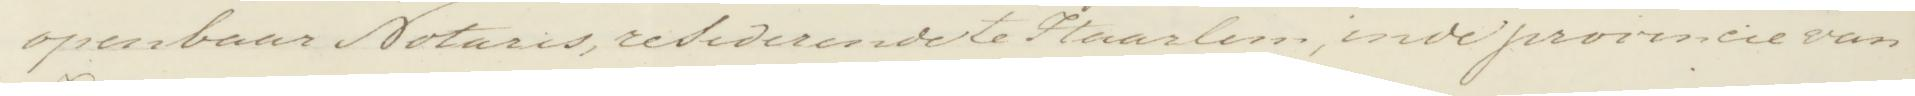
openbaar Notaris, residerende te Haarlem, in de provincie van
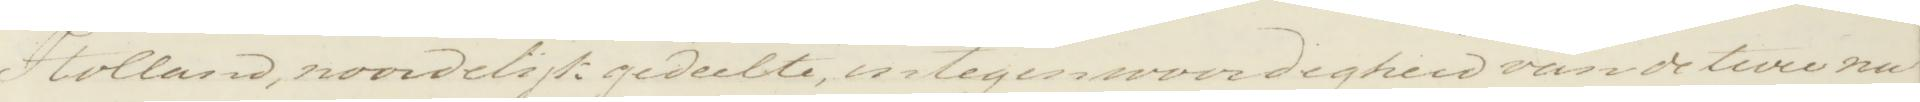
Holland, noordelijk gedeelte, integenwoordigheid van de twee na
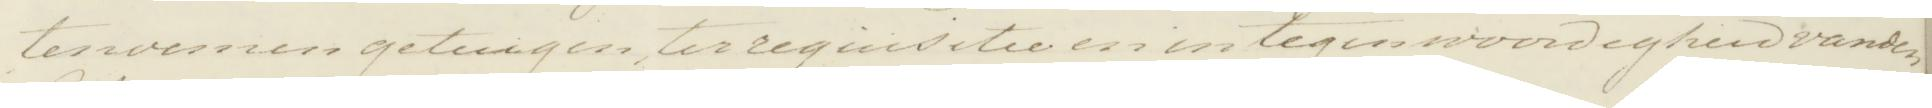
tenoemen getuigen, ter requisitie en in tegenwoordigheid vanden
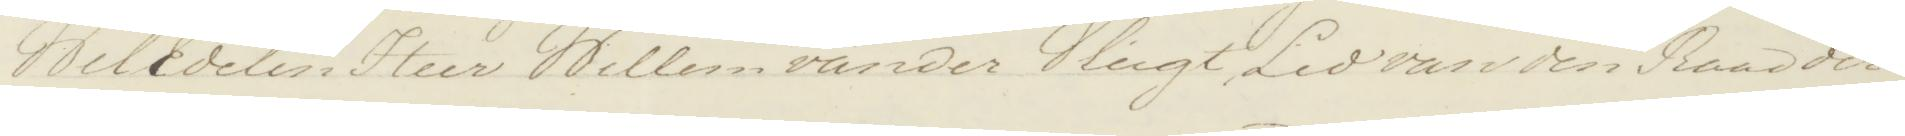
WelEdelen Heer Willem vander Vlugt, Lid van den Raad der
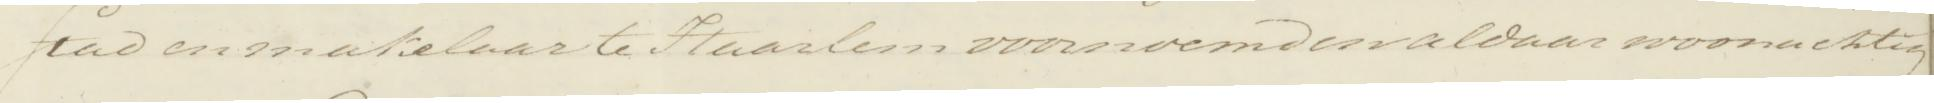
Stad en makelaar te Haarlem voornoemd en aldaar woonachtig
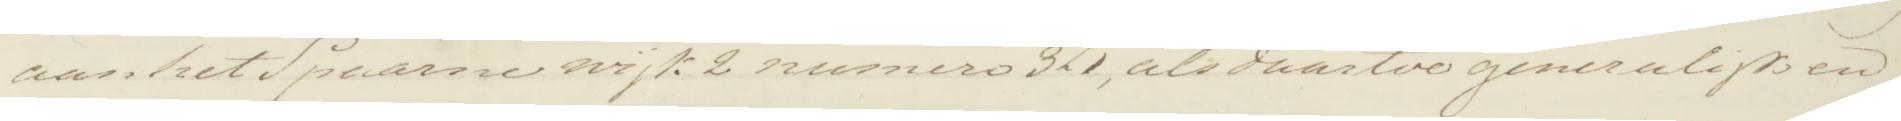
aan het Spaarne wijk 2 numero 34, als daartoe generalijk en
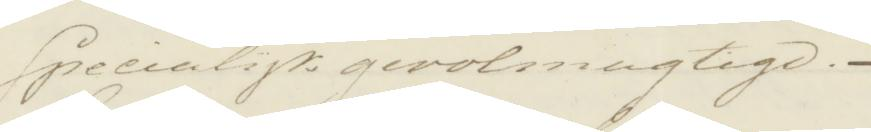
Specialijk gevolmagtigd.-
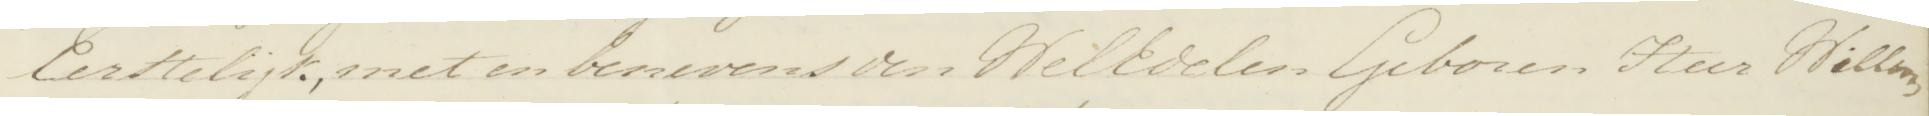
Eerstelijk, met en benevens den WelEdelen Geboren Heer Willem
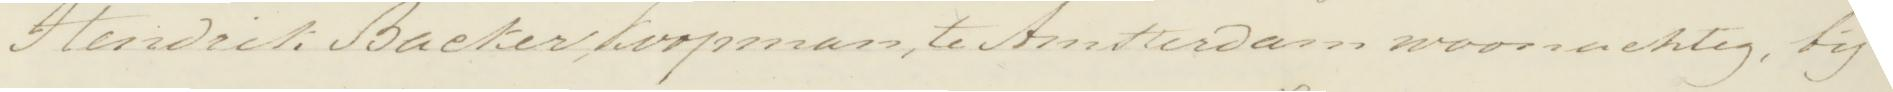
Hendrik Backer, koopman, te Amsterdam woonachtig, bij
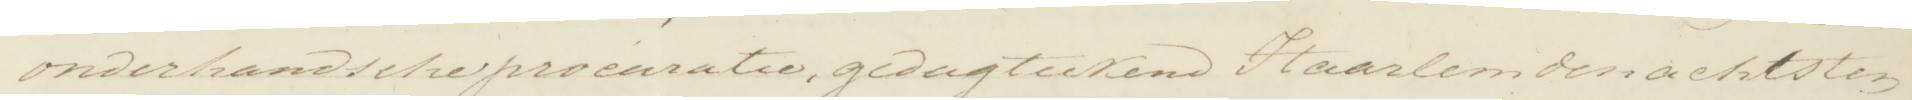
onderhandsche procuratie, gedagteekend Haarlem den achtsten
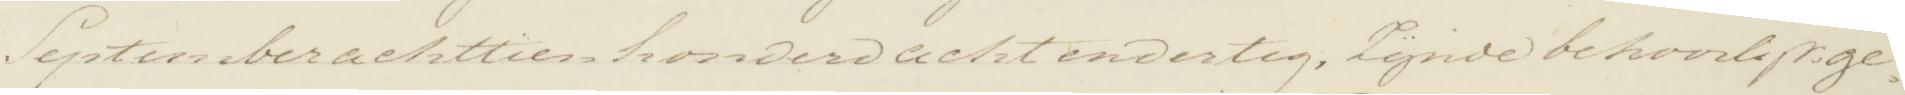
September achttien honderd acht endertig, Zijnde behoorlyk ge„
